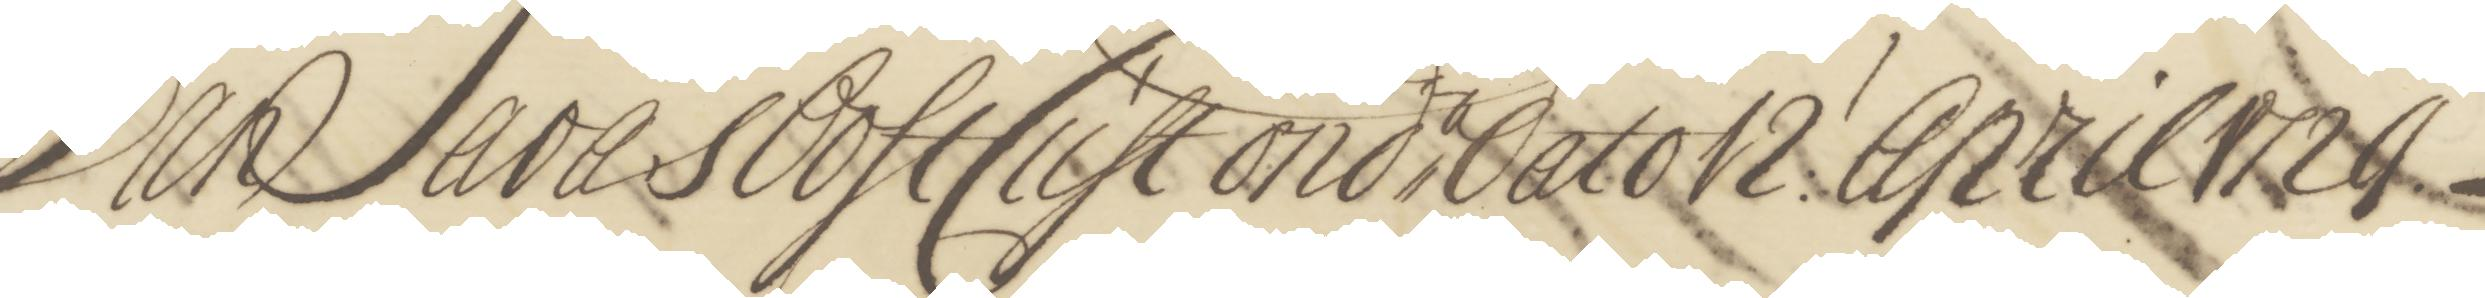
Van Java's Oost Cust ond„r dato 12:' april 1724. —
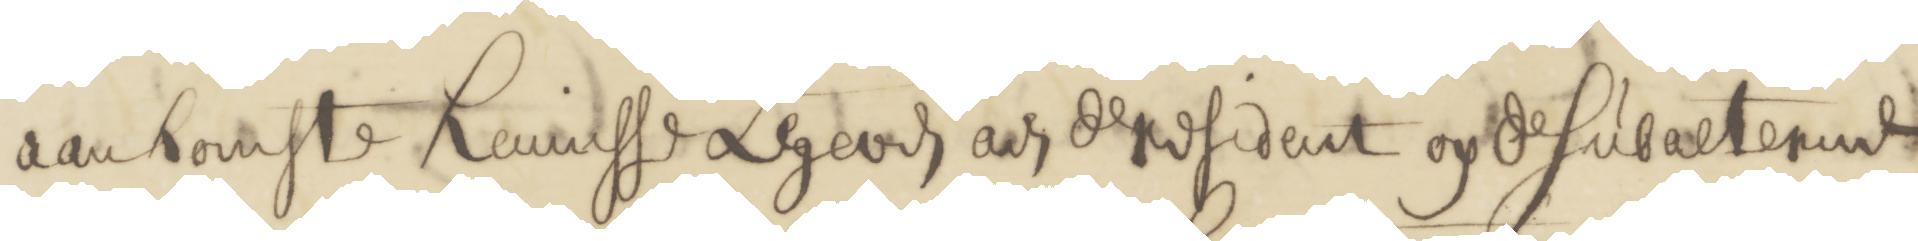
aan komste kennisse te geven aen de resident op de subalterne
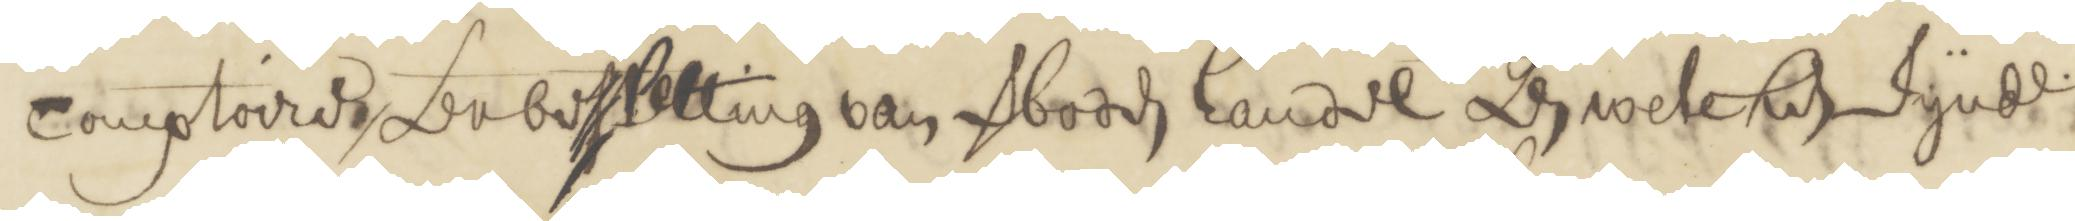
comptoire, ter beletting van verboden handel ten welcken Eijnde
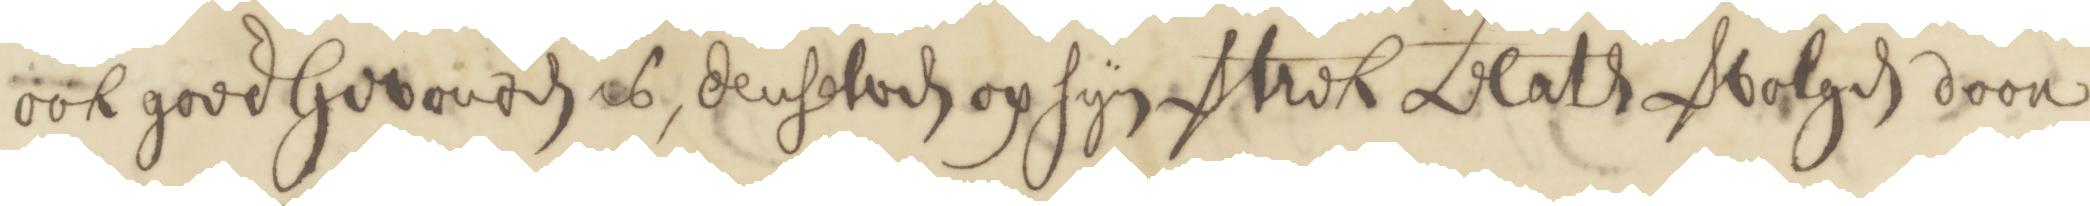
ook goed gevonden is, denselven op sijn vertrek te laten vervolgen door
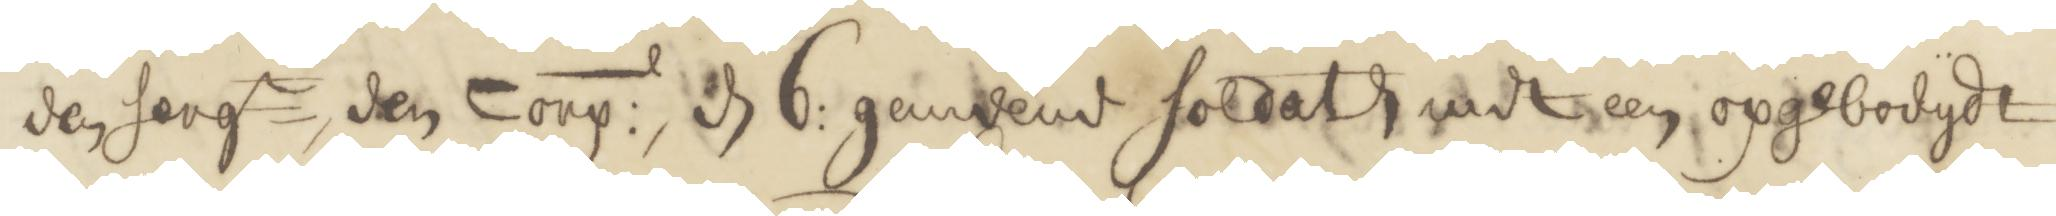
een serg=t, een Corp:l, en 6: gemeene soldaten met een opgeboeijdt
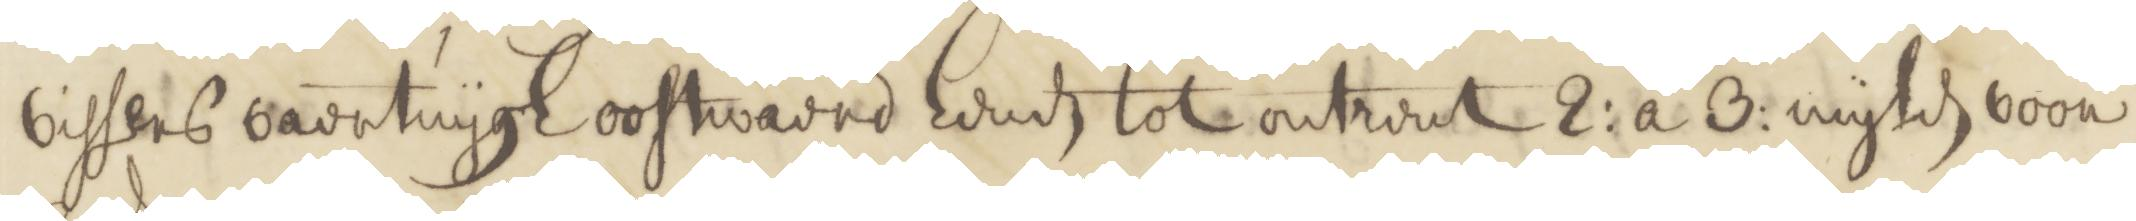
vissers vaertuijgh oostwaerd henen tot ontrent 2: â 3: mijlen voor
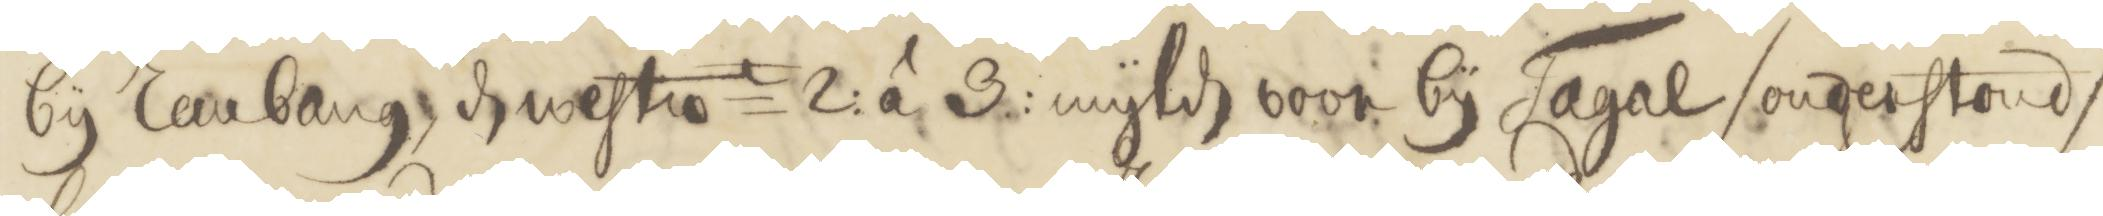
bij Rembang, en westw=t 2: â 3: mijlen voor bij Tagal /onderstond /
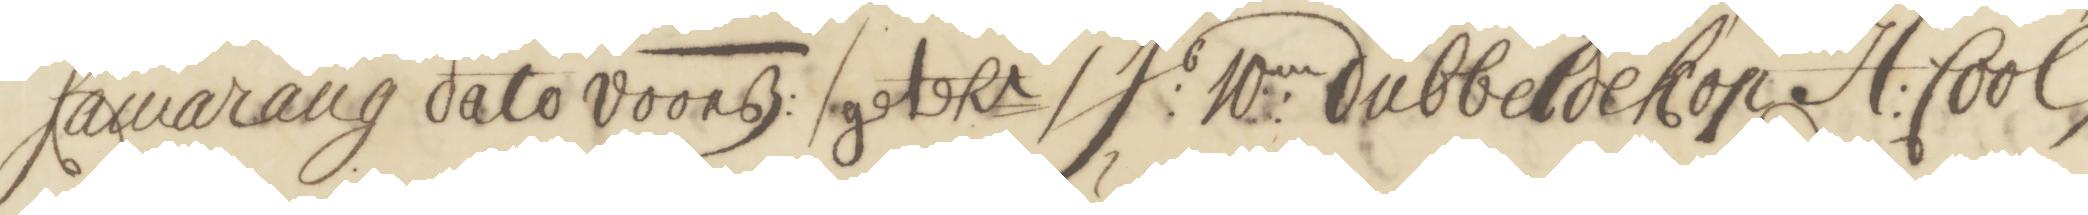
Samarang dato voorsz: /getek=t/ J:s W:m dubbeldekop H: Cool
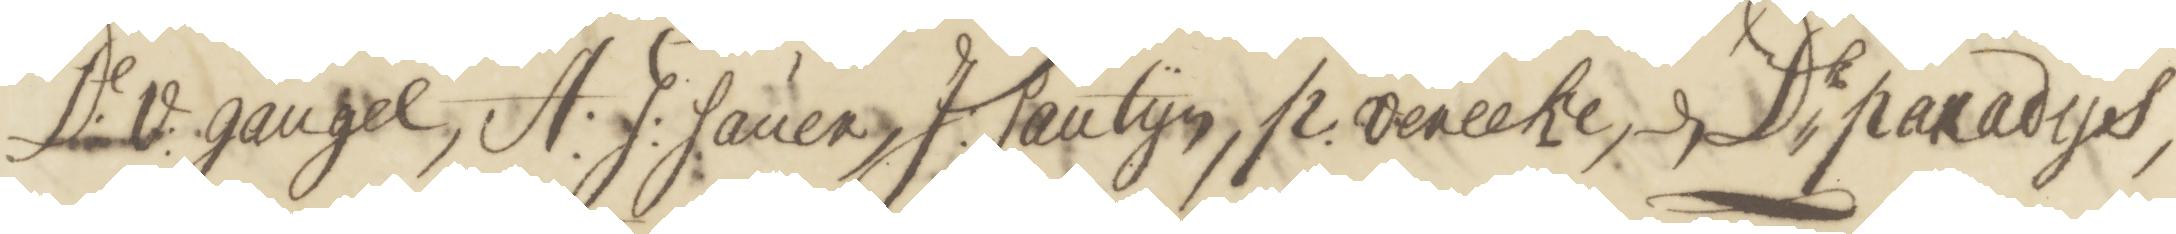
D:l v: gangel, A: J: Sauer, J: Sautijn, p: vereeke, en D„k paradijs,
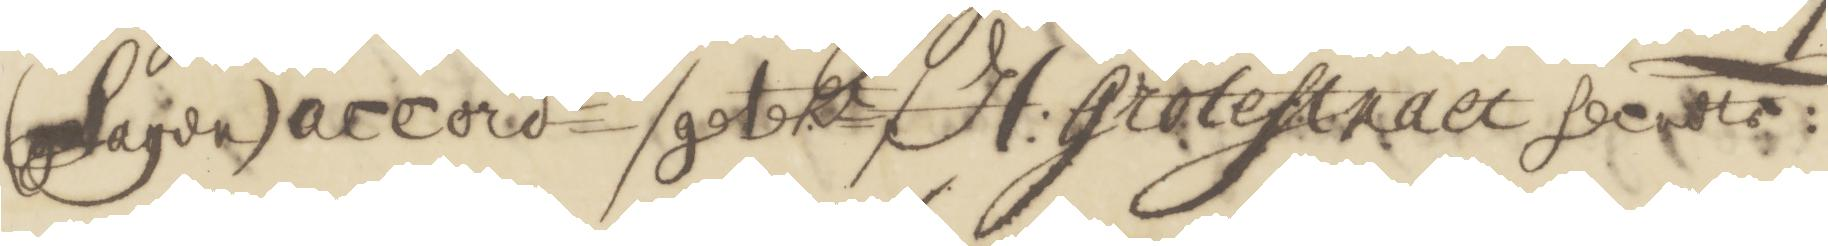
(gelager) accord=t /getek=t/ H: grotestraet secrets:
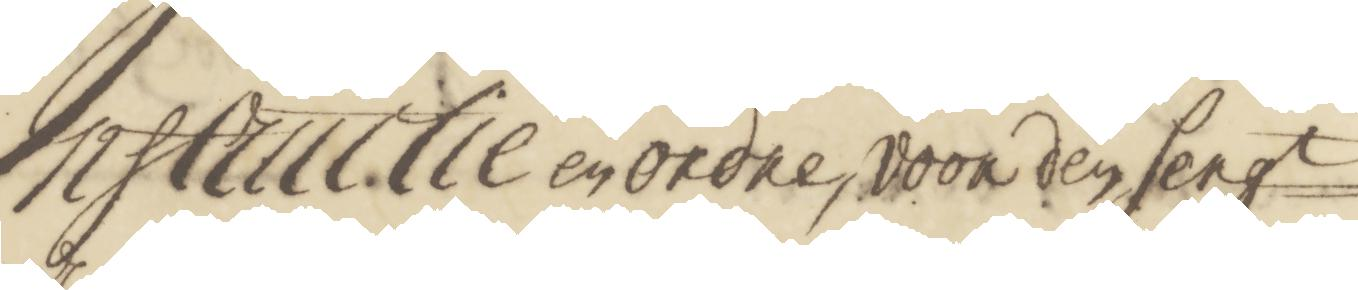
Jnstructie en ordre, voor den Serg=t
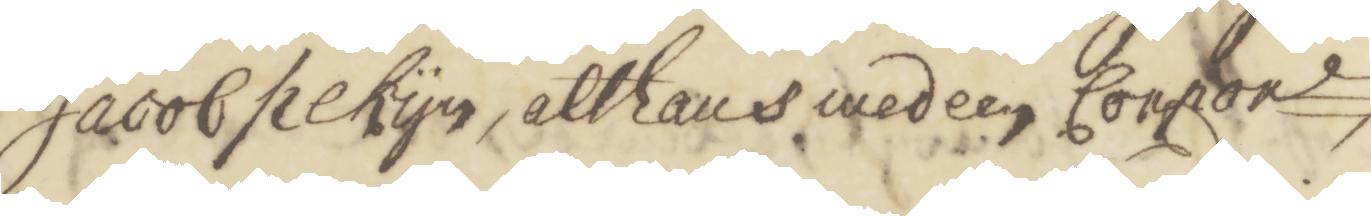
Jacob pekijn, althans med een Corpor=l,
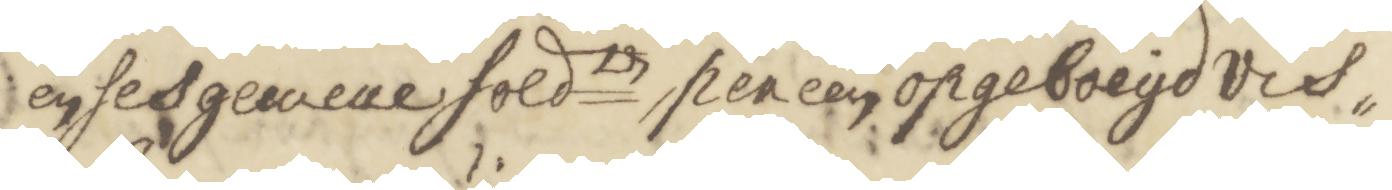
en ses gemene sold=ten, per een opgeboeijd vis„
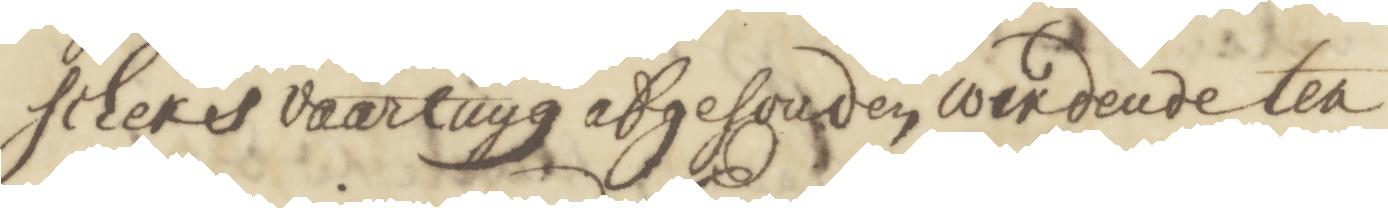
schers vaartuijg afgesonden werdende ter
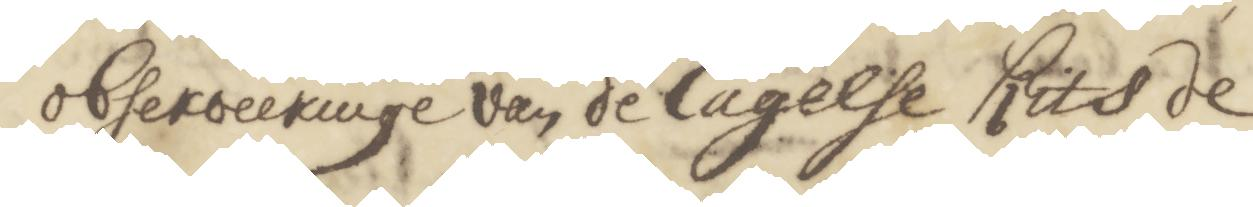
observeeringe van de Engelse kits de
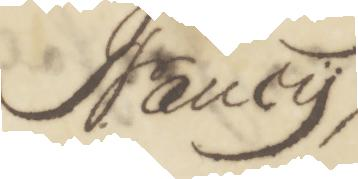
Nancij
